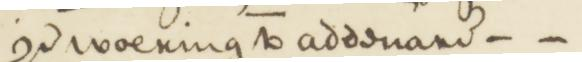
je woering vaddenare
